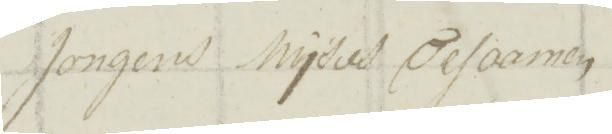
Jongens Mijsies Tesaamen
